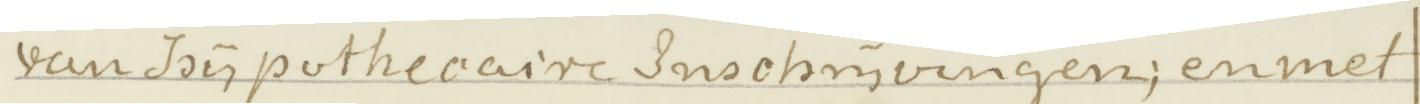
van hijpothecaire Inschrijvingen; en met
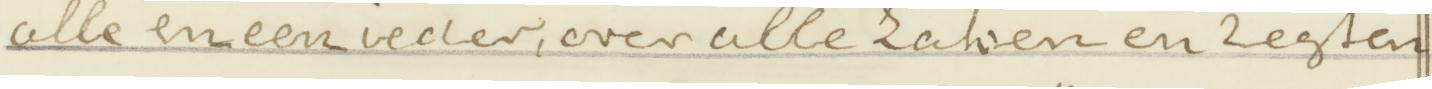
alle en een ieder, over alle zaken en regten
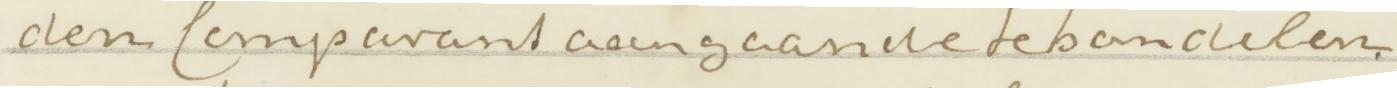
den Comparant aangaande te handelen,
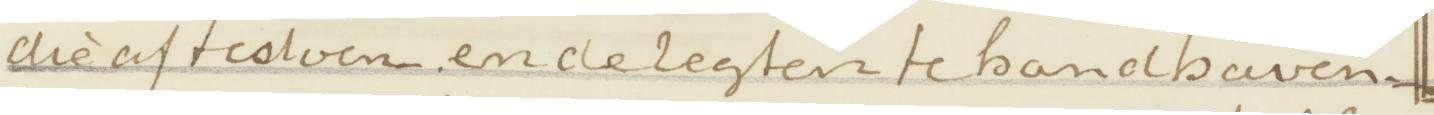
die af tedoen, en de regten te handhaven-
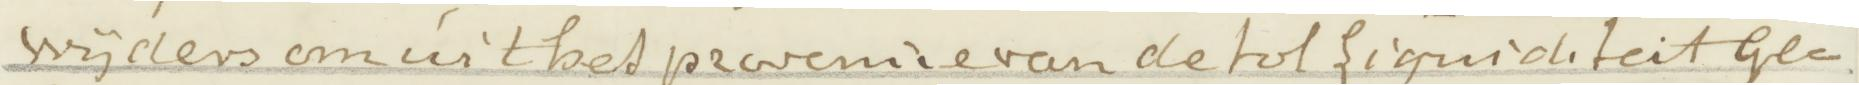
wijders om uit het provenue van de tot Liquiditeit ge=
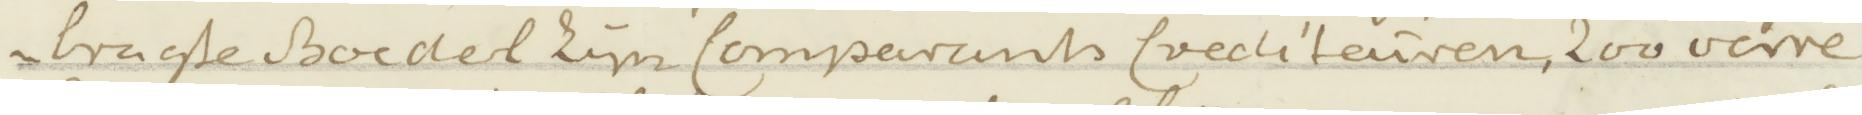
=bragte Boedel zijn Comparants Crediteuren, zoo verre
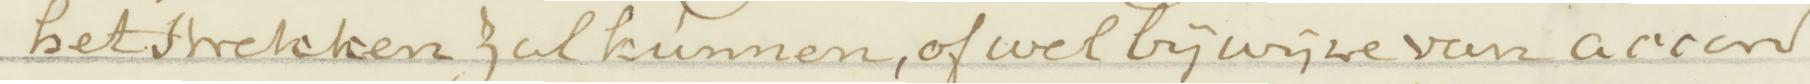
het strekken zal kunnen, of wel bij wijze van accord
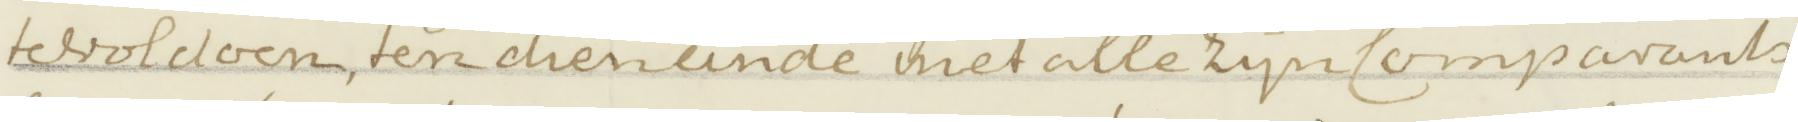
tevoldoen, ten dien einde met alle zyn Comparants
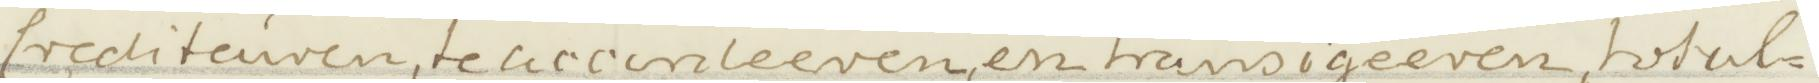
Crediteuren, te accordeeren, en transigeeren, tot al=
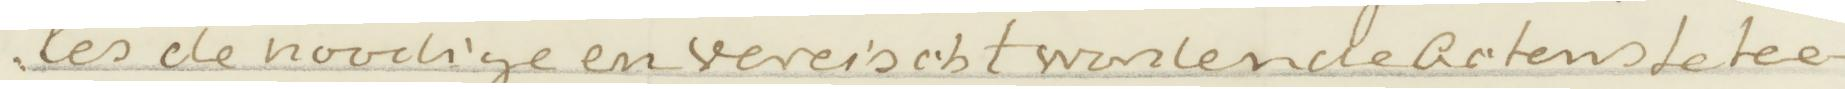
„les de noodige en vereischt wordende Actens te tee
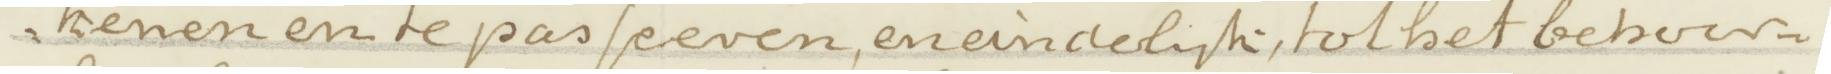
=kenen en te passeeren, en eindelijk, tot het behoor=
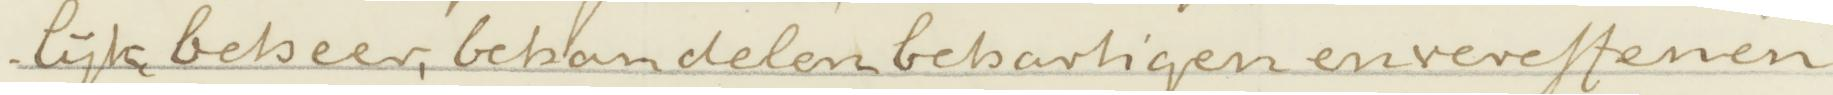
„lijk beheer, behandelen behartigen en vereffenen
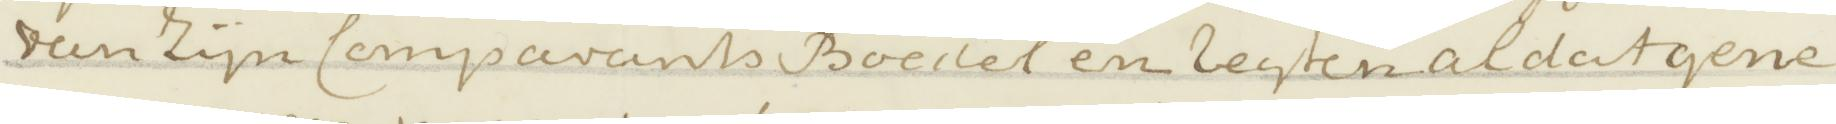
van Zijn Comparants Boedel en Regten aldatgene
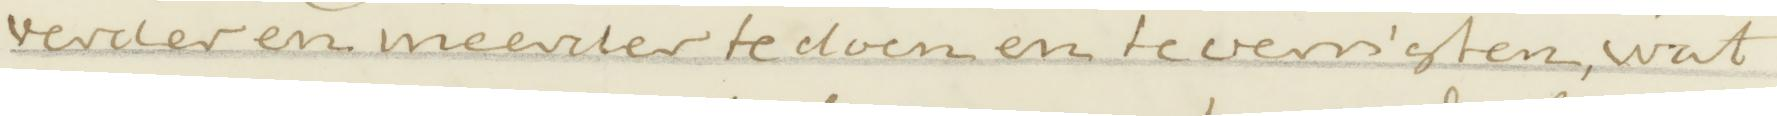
verder en meerder te doen en te verrigten, wat
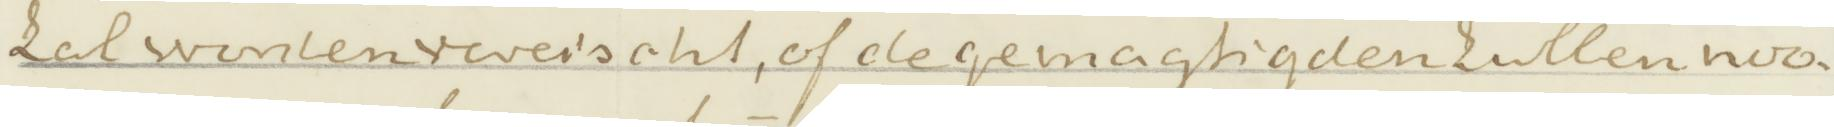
zal worden vereischt, of de gemagtigden zullen noo=
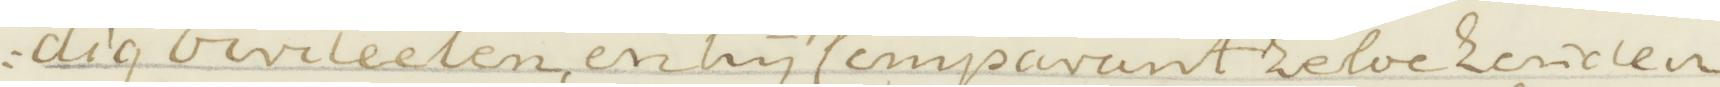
=dig oordeelen en hij Comparant zelve zouden
